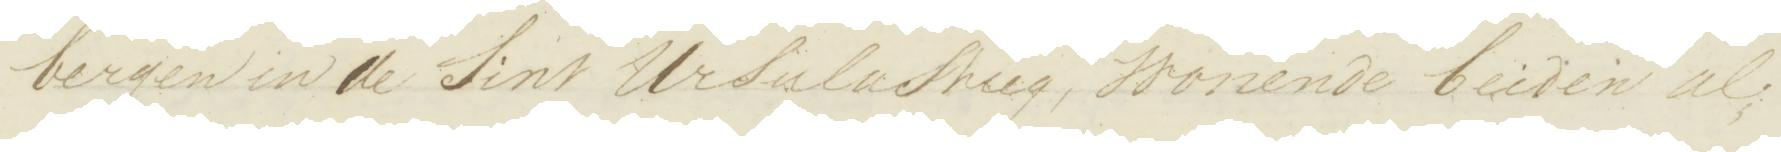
bergen in de Sint Ursulasteeg, wonende beiden al„
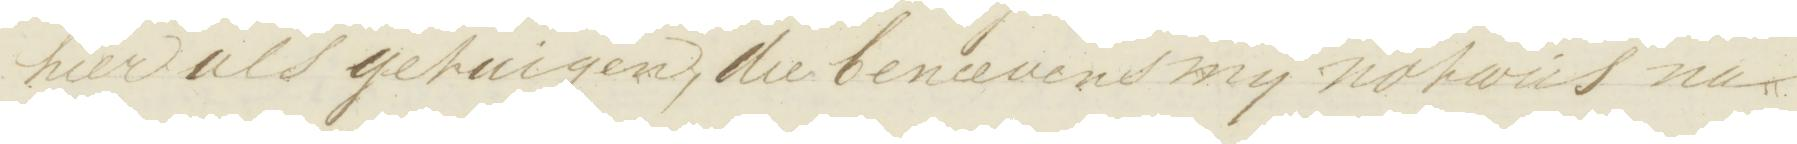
hier als getuigen, die beneevens my notaris na
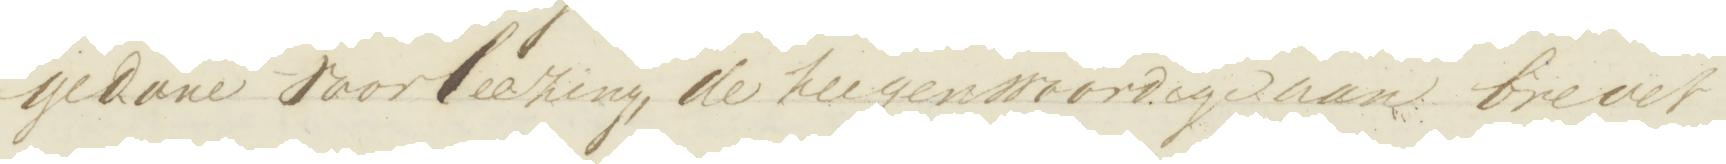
gedane voorleezing, de teegenwoordige aan brevet
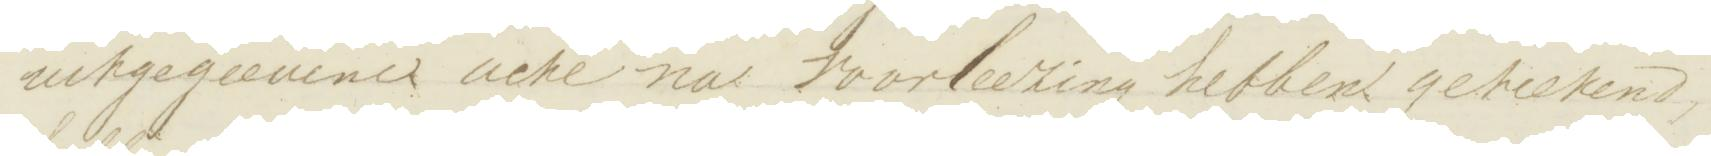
uitgegeevene acte na Voorleezing hebben geteekend,
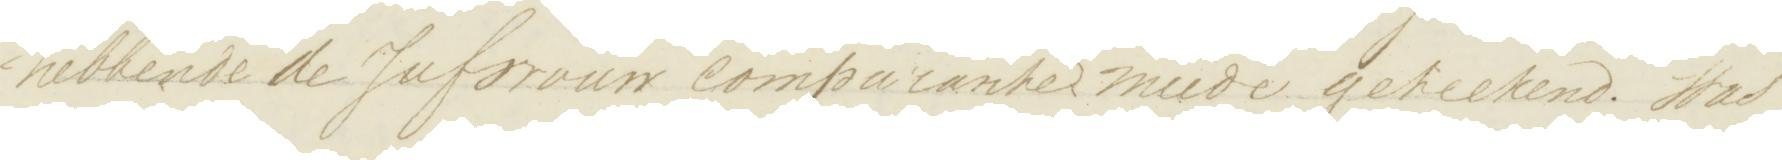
hebbende de Jufvrouw comparante meede geteekend. Was
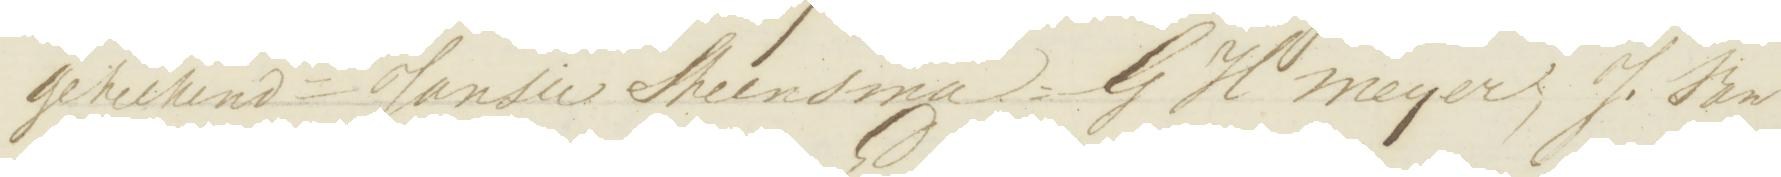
geteekend = Jansie Steensma. = G H meyer, J. Van
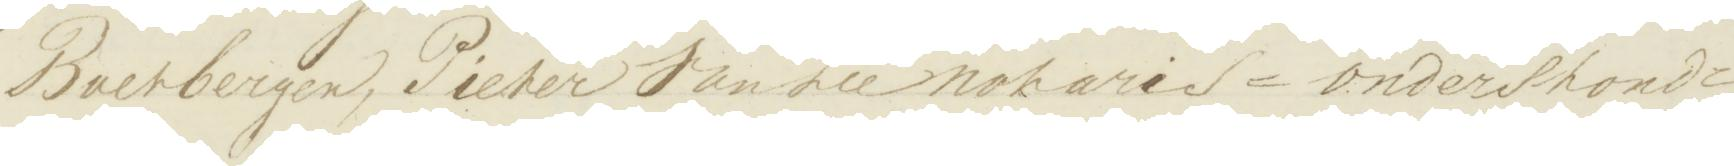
Boetbergen, Pieter Van Lee notaris = onderstondt
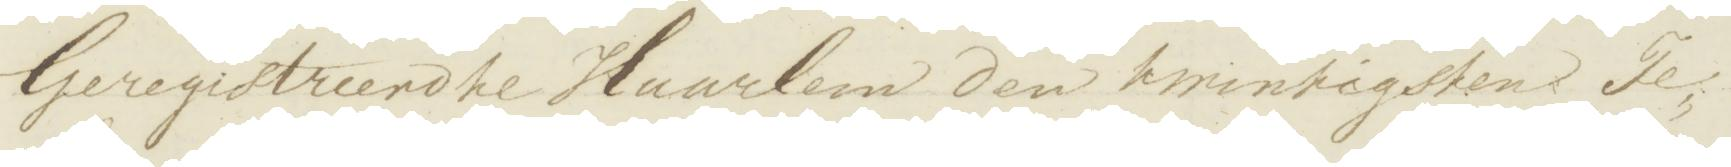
Geregistreerd te Haarlem den twintigsten Fe„
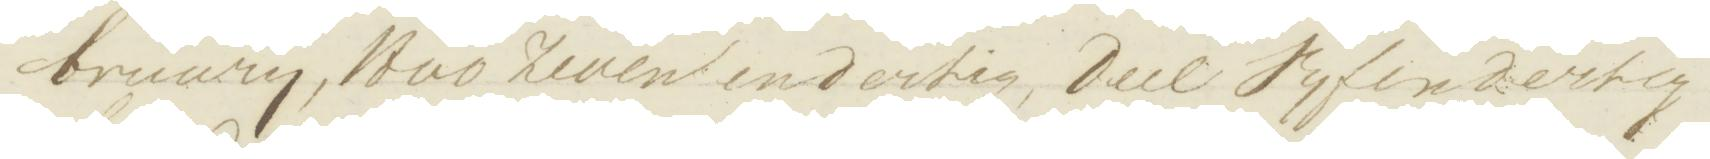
bruary, 1800 zeven en dertig, deel Vyf en dertig
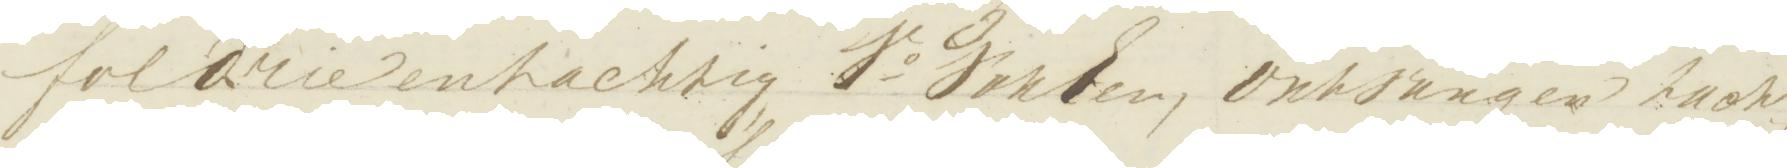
fol drie en tachtig V-o Vak Een, Ontvangen tach
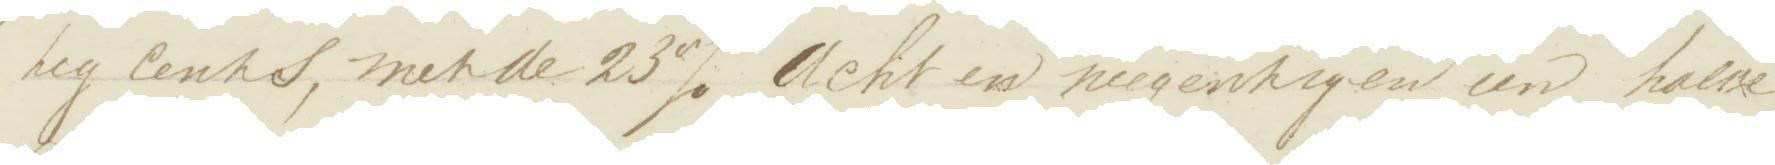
tig cents, met de 23% Acht en neegentig en een halve
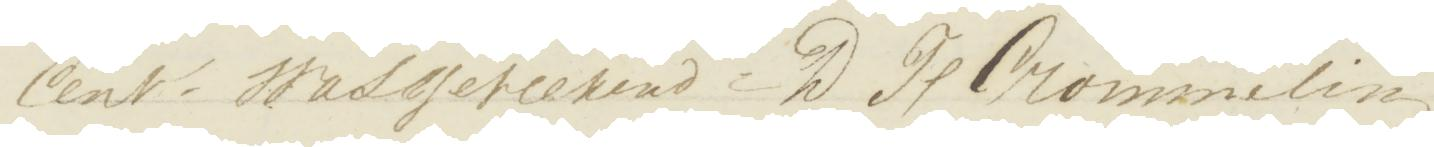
Cent. Was geteekend — D F Crommelin
